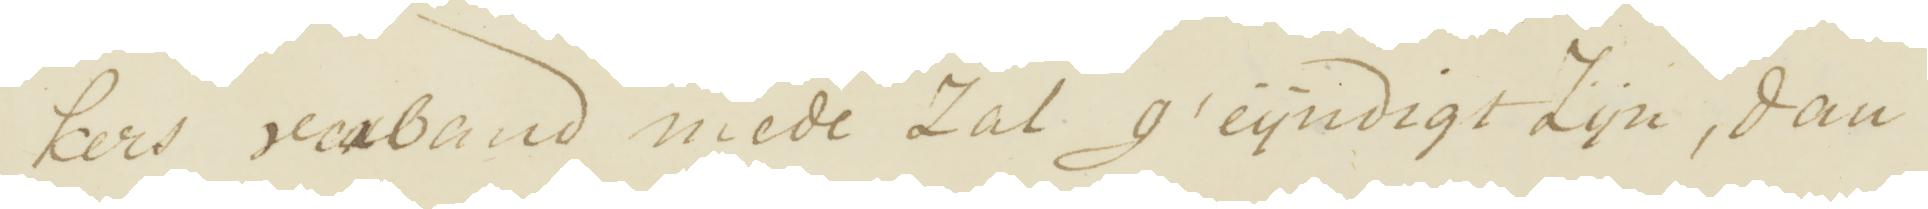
kers verband mede zal g’eijndigt zijn, dan
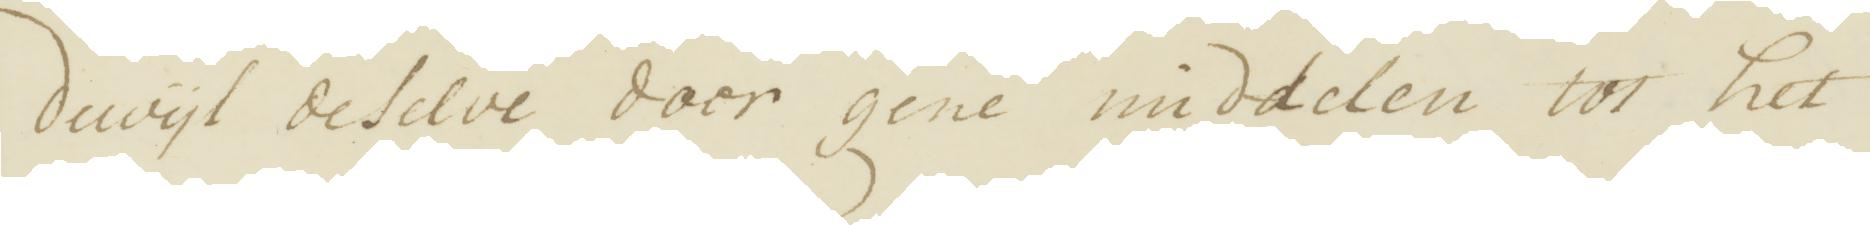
dewijl deselve door gene middelen tot het
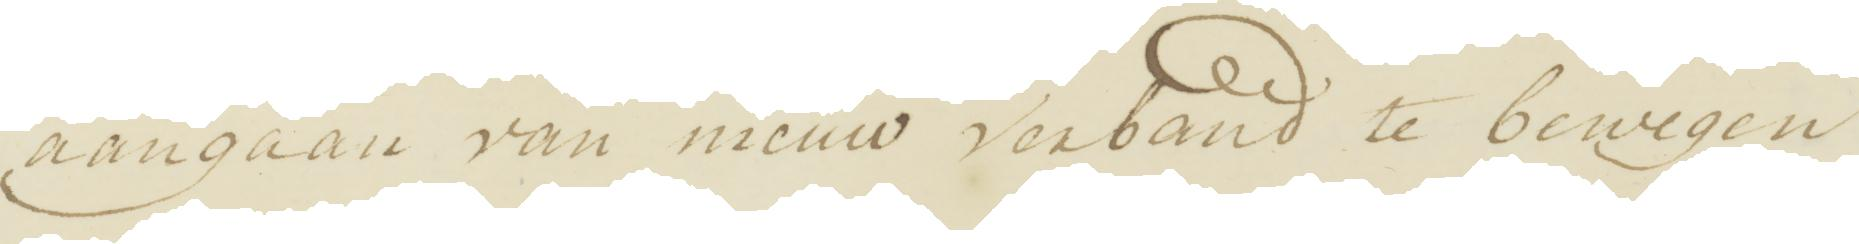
aangaan van nieuw verband te bewegen
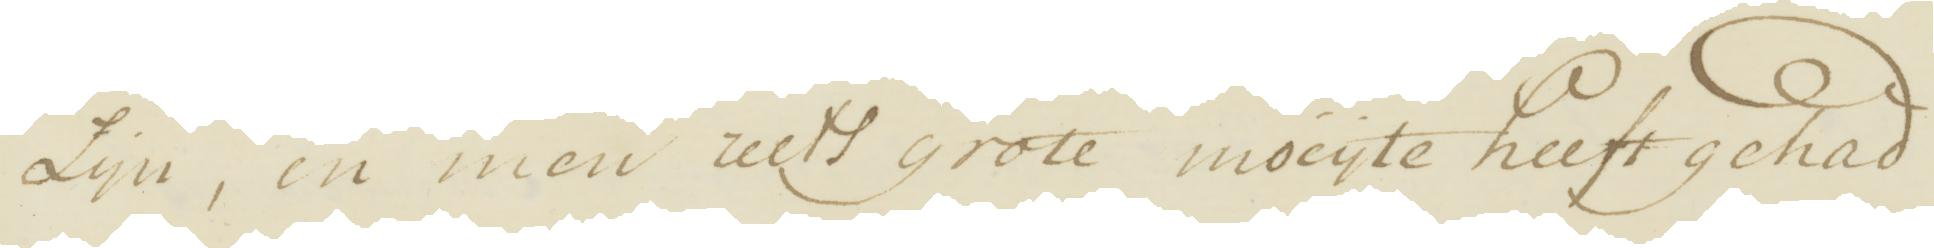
zijn, en men reets grote moeijte heeft gehad
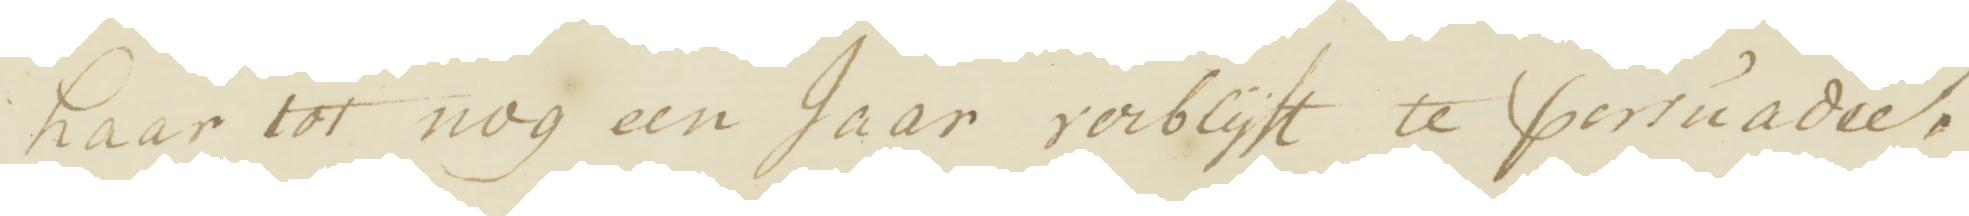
haar tot nog een Jaar verblijft te persuadee„
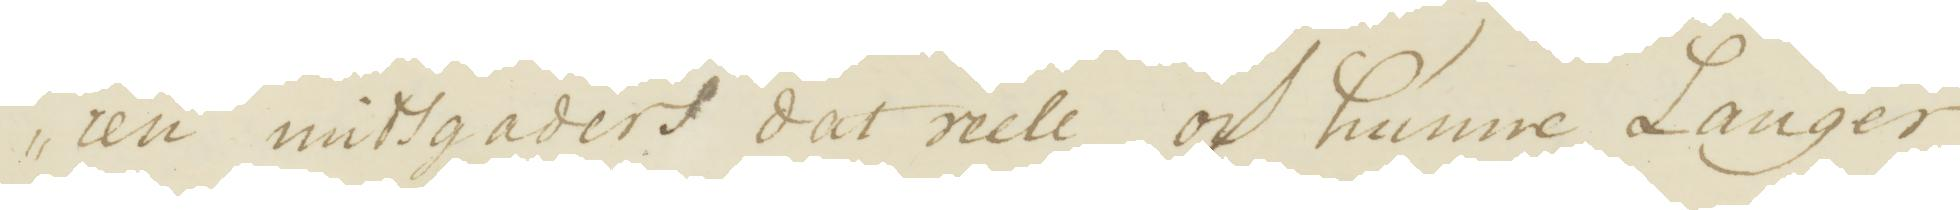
„ren mitsgaders dat veele over hunne Langer
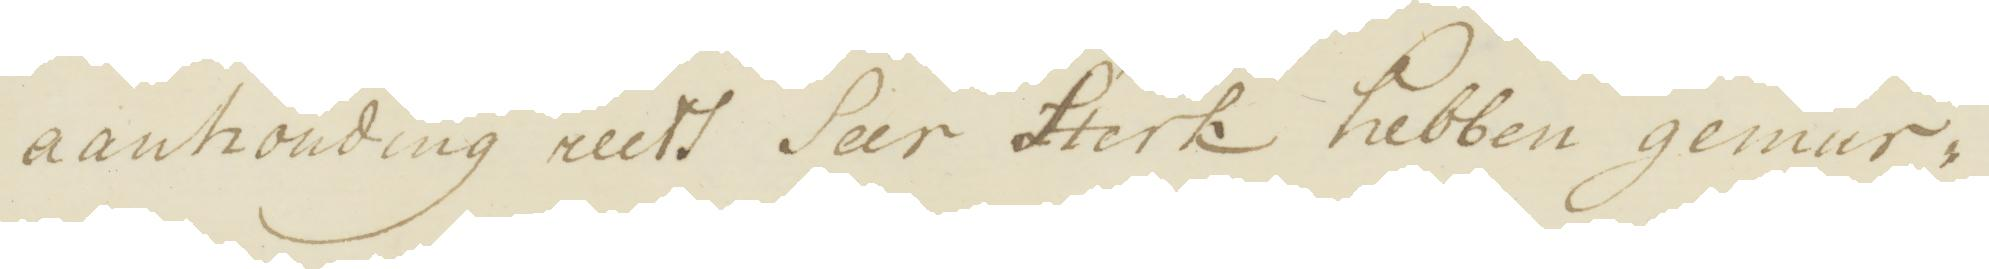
aanhouding reets seer sterk hebben gemur„
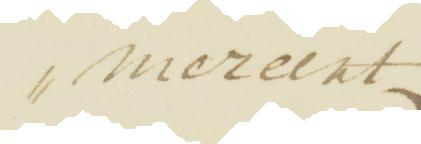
„mereert
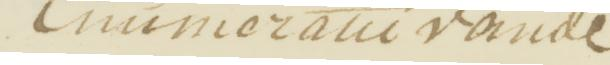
Enumeratie van de
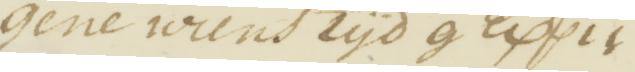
gene wiens tijd g Expi
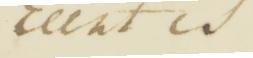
reert is
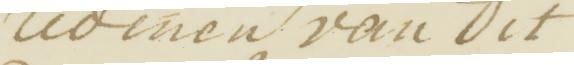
redenen van dit
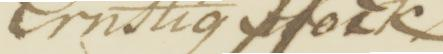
Ernstig versoek
